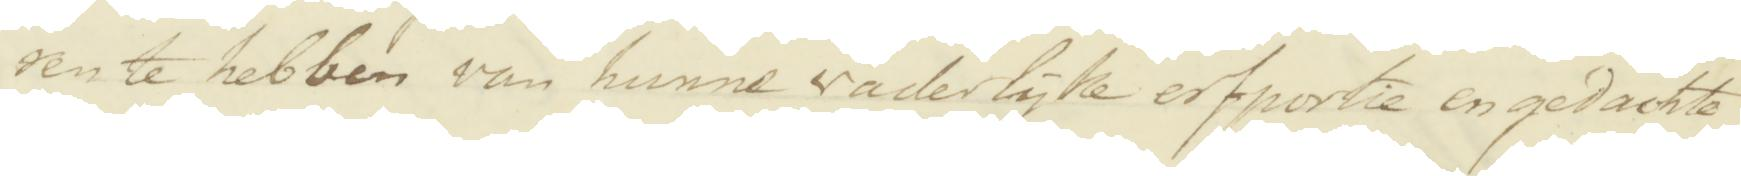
ren te hebben van hunne vaderlijke erfportie en gedachte
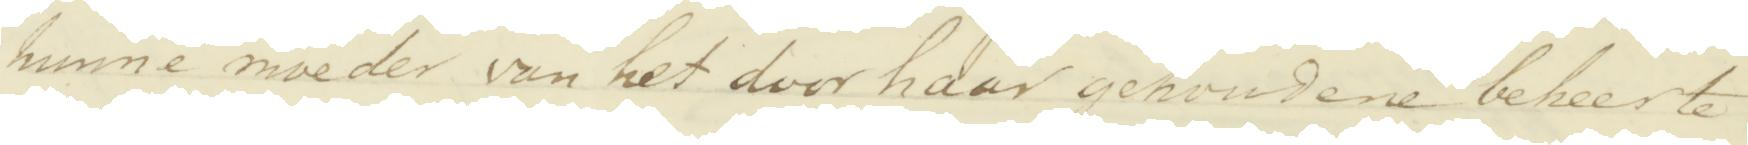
hunne moeder van het door haar gehoudene beheer te
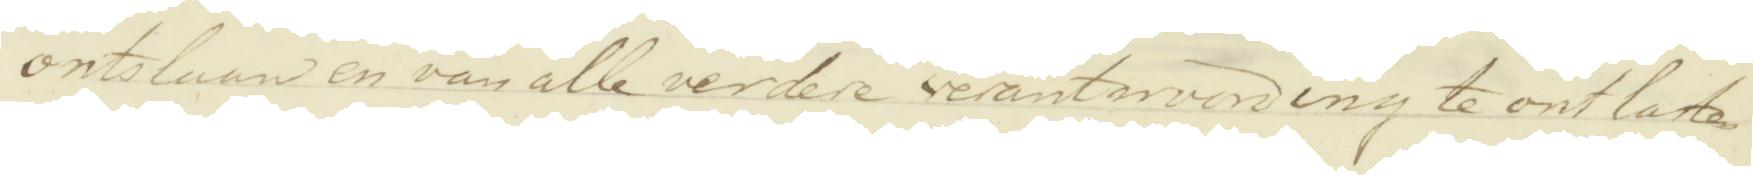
ontslaan en van alle verdere verantwoording te ontlasten
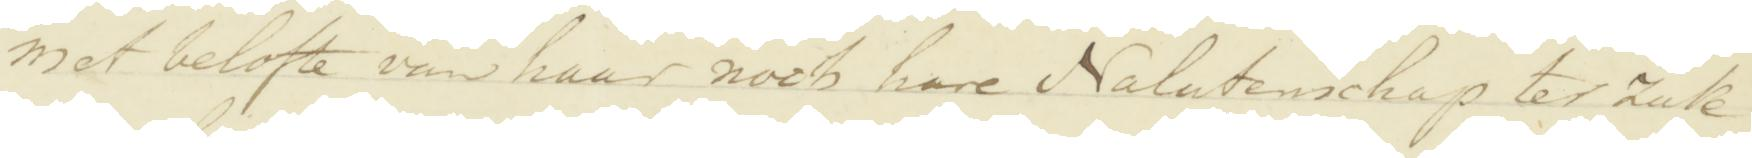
met belofte van haar noch hare Nalatenschap ter zake
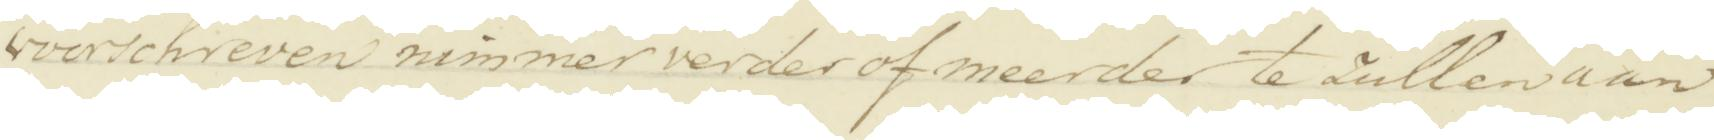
voorschreven nimmer verder of meerder te zullen aan
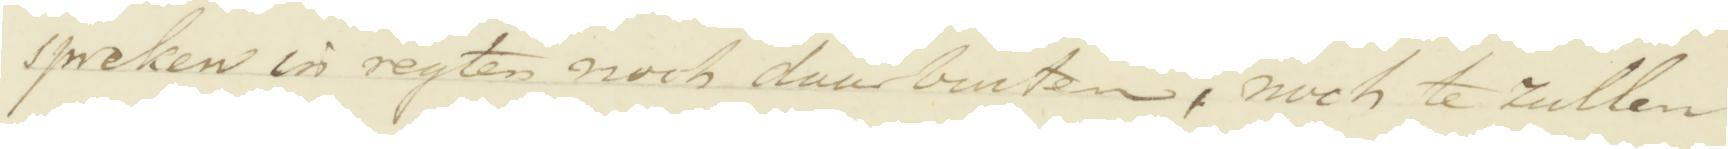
spreken in regten noch daar buiten, noch te zullen
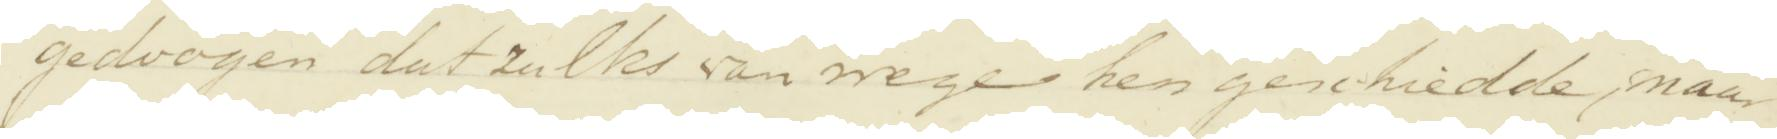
gedoogen dat zulks van wege hen geschiedde, maar
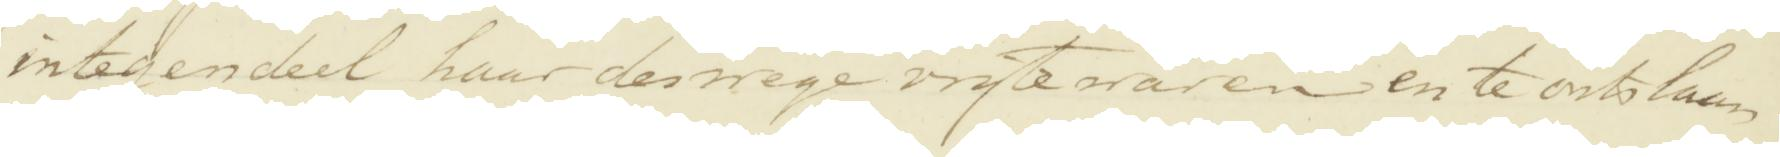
integendeel haar deswege vrijte waren en te ontslaan
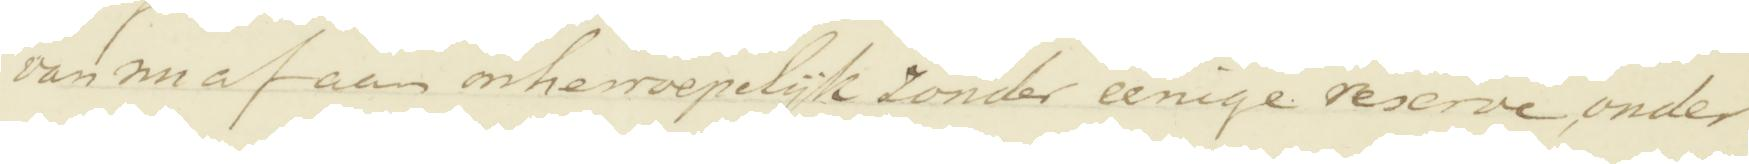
van nu af aan onherroepelijk zonder eenige reserve, onder
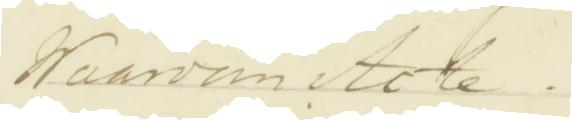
Waarven Acte.
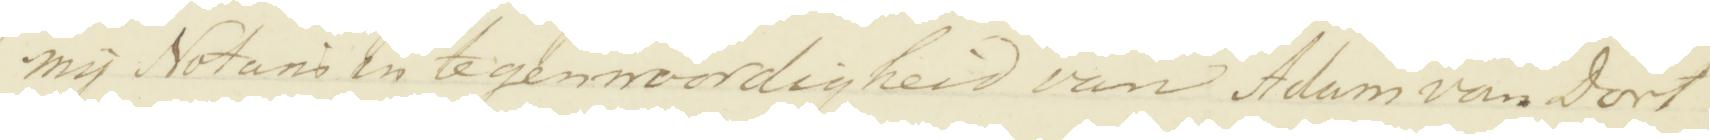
mij Notaris in tegenwoordigheid van Adam van Dort
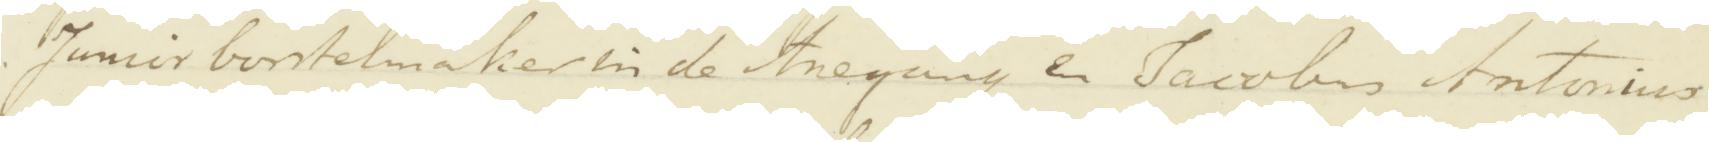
Junior borstelmaker in de Anegang & Iacobus Antonius
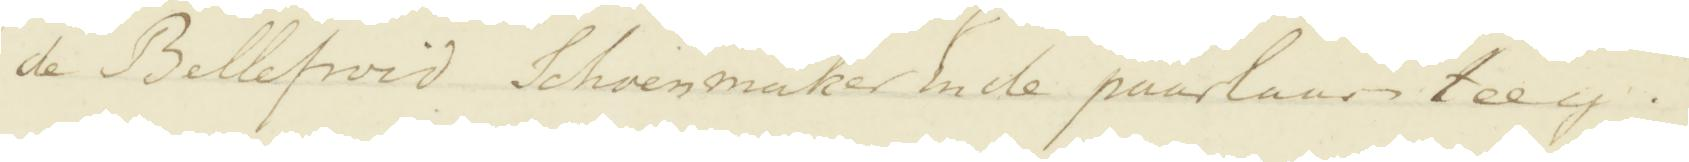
de Bellefroid Schoenmaker in de paarlaarsteeg.
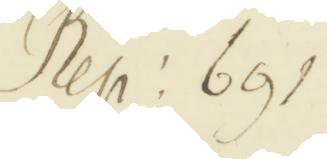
Rep: 691
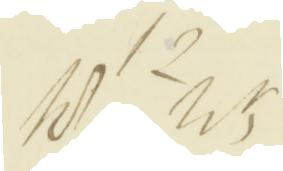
18 -12 45
